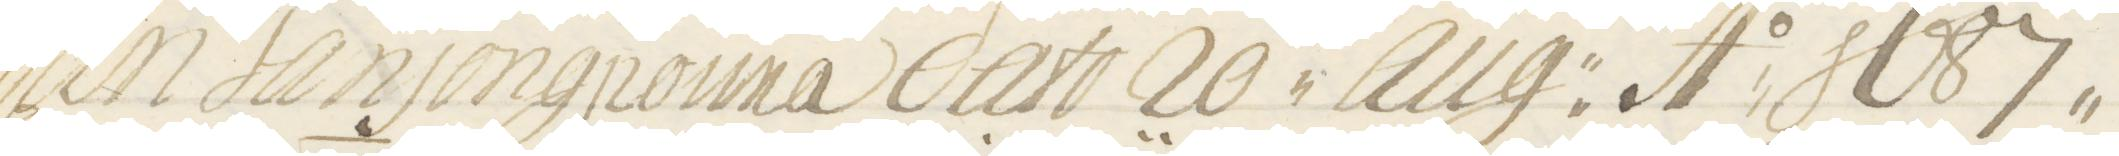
an Tanjongpoura dato 20„ aug„“ A„o 1687„
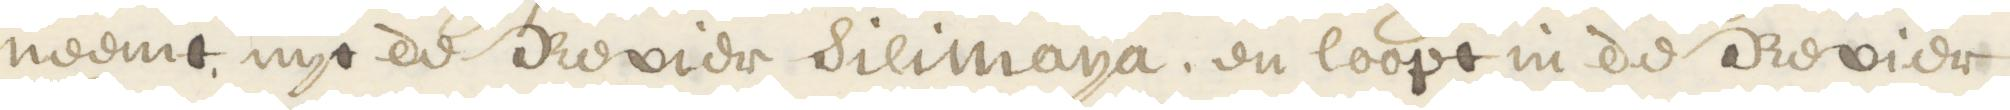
neemt uijt de Revier silimaija. en loopt in de Revier
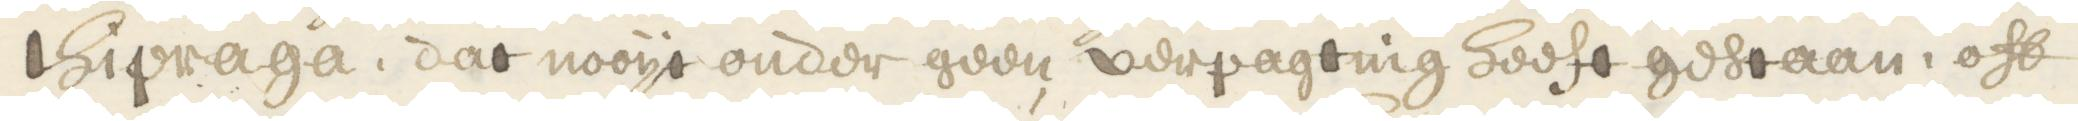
thipraga, dat nooijt onder geen verpagting heeft gestaan, oft
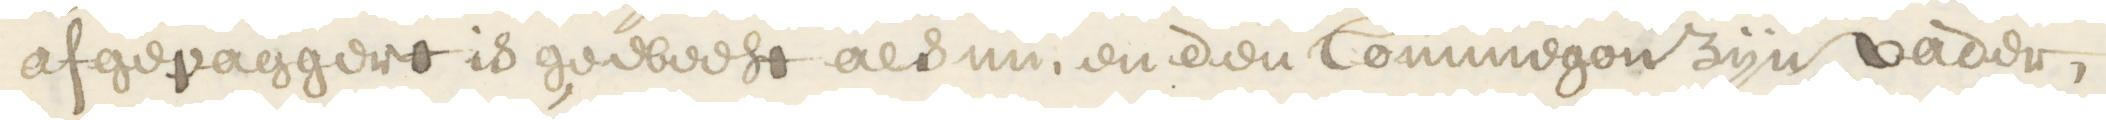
afgepaggert is geweest als nu, en den Commegon zijn vader,
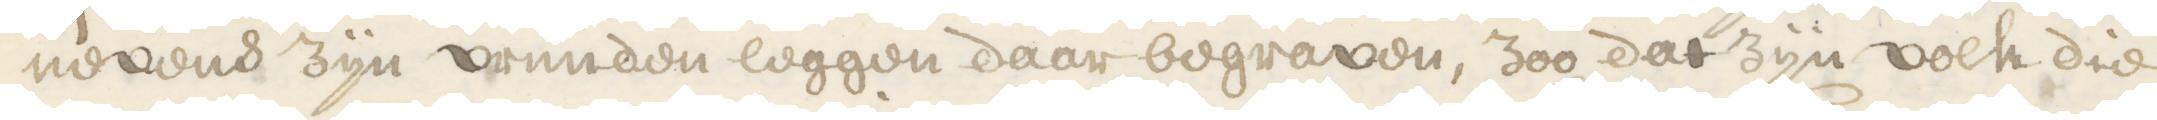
nevens zijn vrunden leggen daar begraven, zoo dat zijn volk die
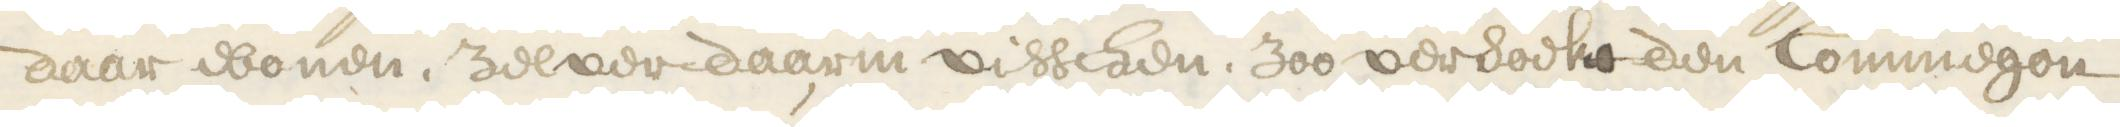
daar wonen, zelver daarin visschen, zoo versoekt den Commegon
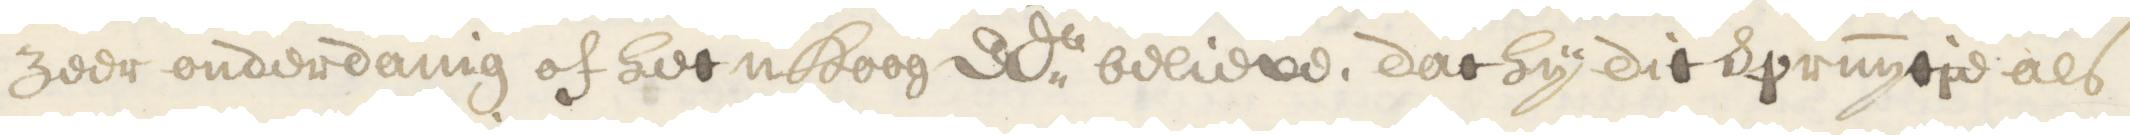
zeer onderdanig of het u Hoog Ed„e believe, dat hij dit spruijtje als
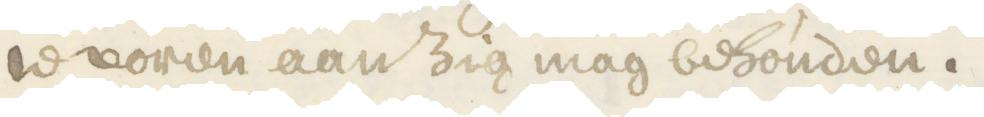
te voren aan zig mag behouden.
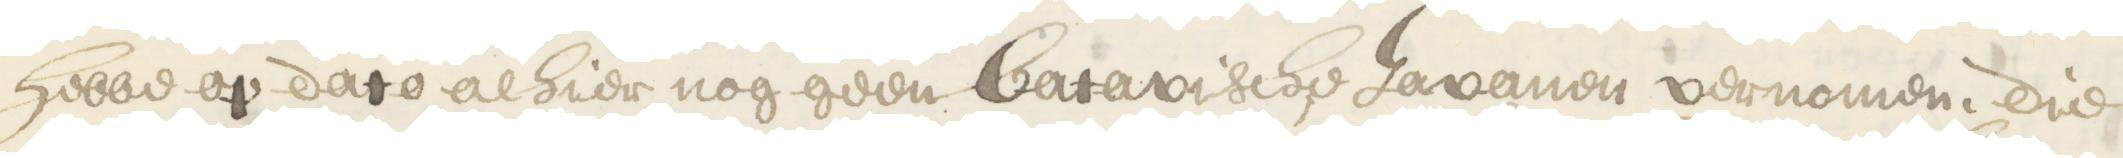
Hebbe op dato alhier nog geen Batavische Javanen vernomen, die
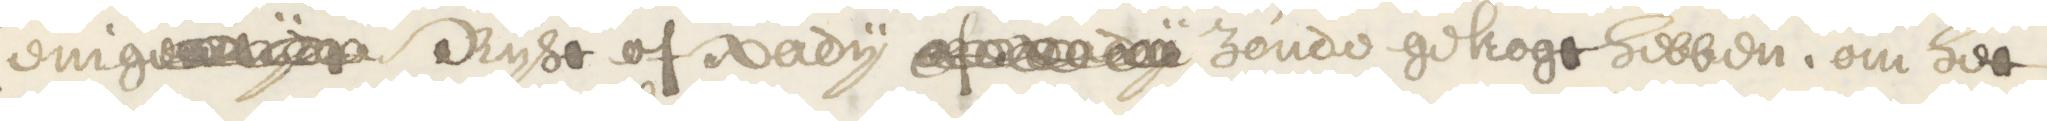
enige Rijst Rijst of padij of padij zoude gekogt hebben, om het
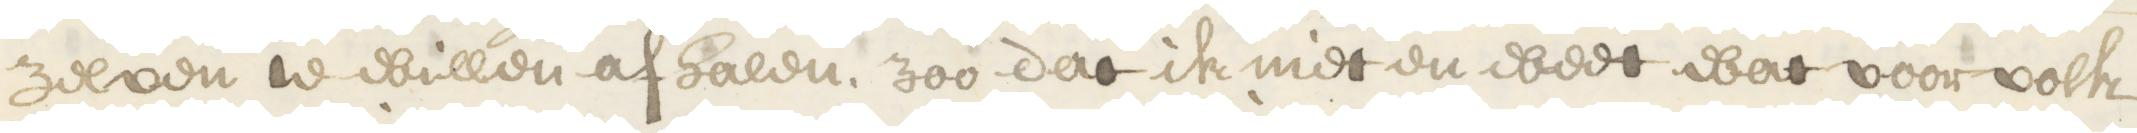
zelven te willen afhalen. zoo dat ik niet en weet wat voor volk
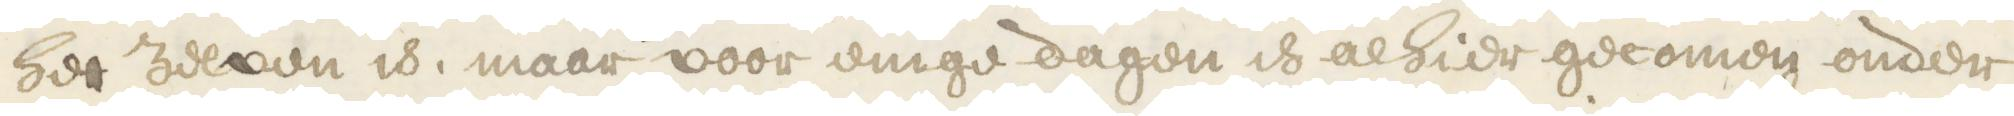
het zelven is, maar voor enige dagen is alhier gecomen onder
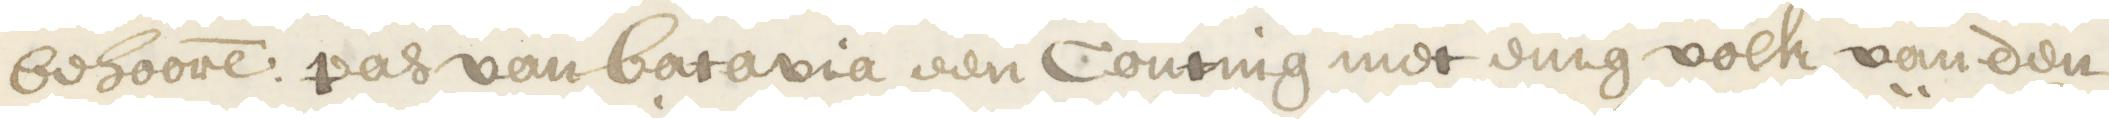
behoorl: pas van batavia een Conting met enig volk van den
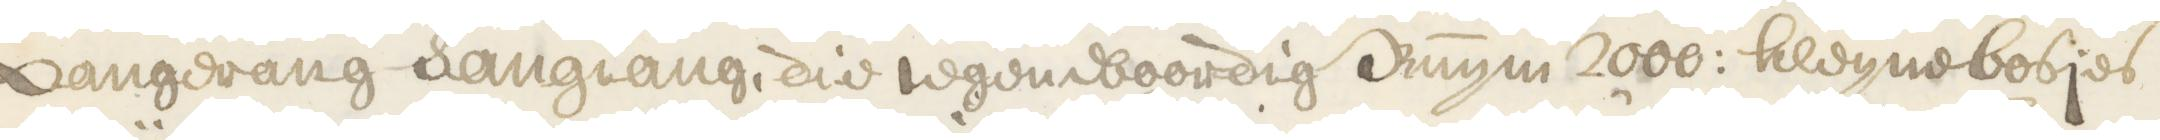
pangerang sangiang, die tegenwoordig Ruijm 2000: kleijne bosjes
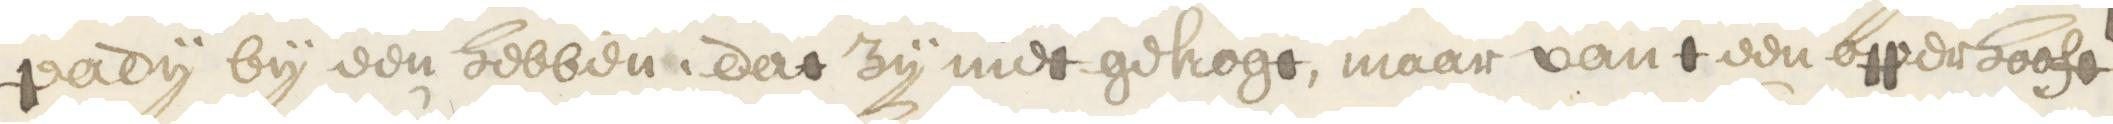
padij bij een hebben, dat zij niet gekogt, maar van t een opperhooft
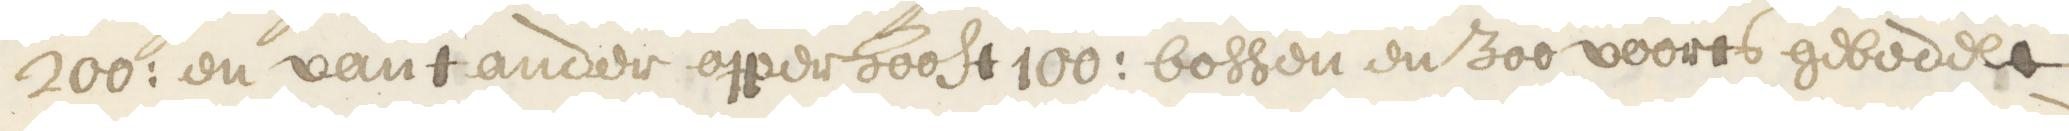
200: en van t ander opperhooft 100: bossen en zoo voorts gebedelt
